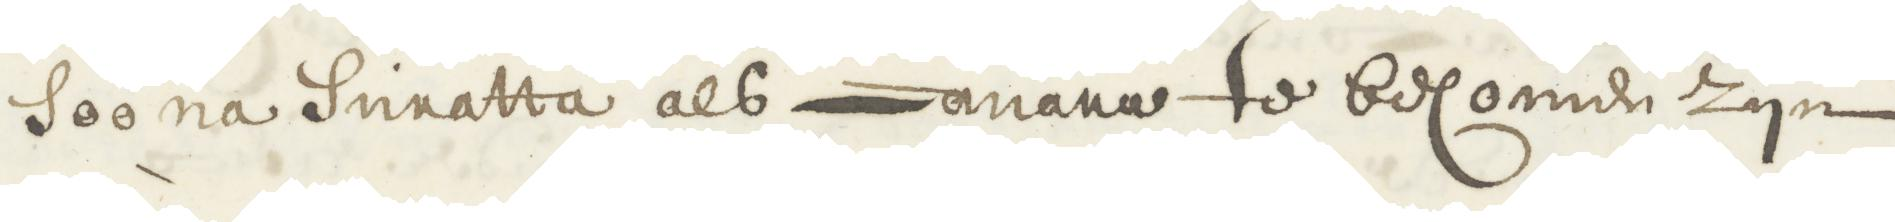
soo na suratta als canara te becomen zijn
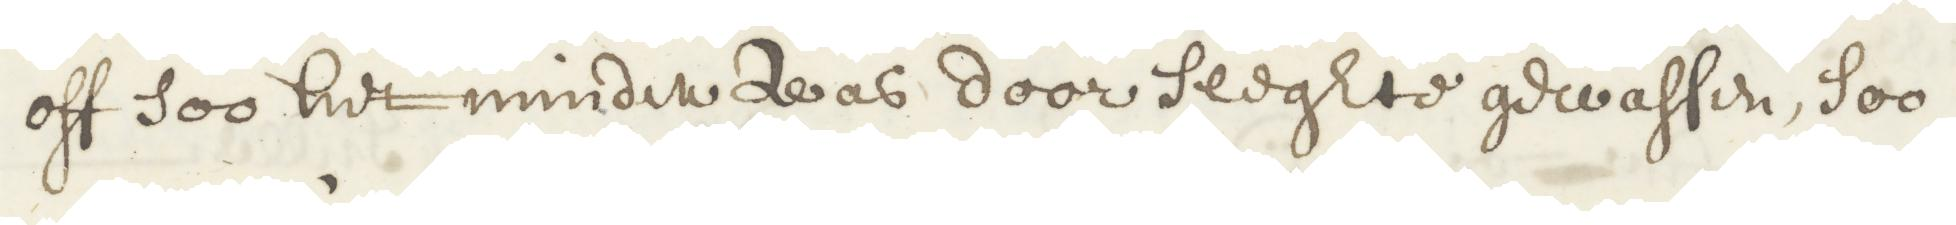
off soo het minder was door sleghte gewassen, soo
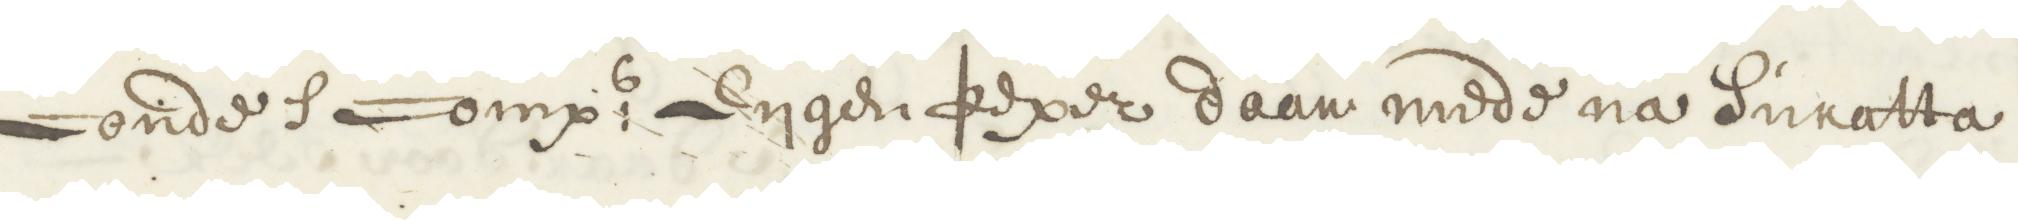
conde ’s comp:s Eygen peper daar mede na suratta
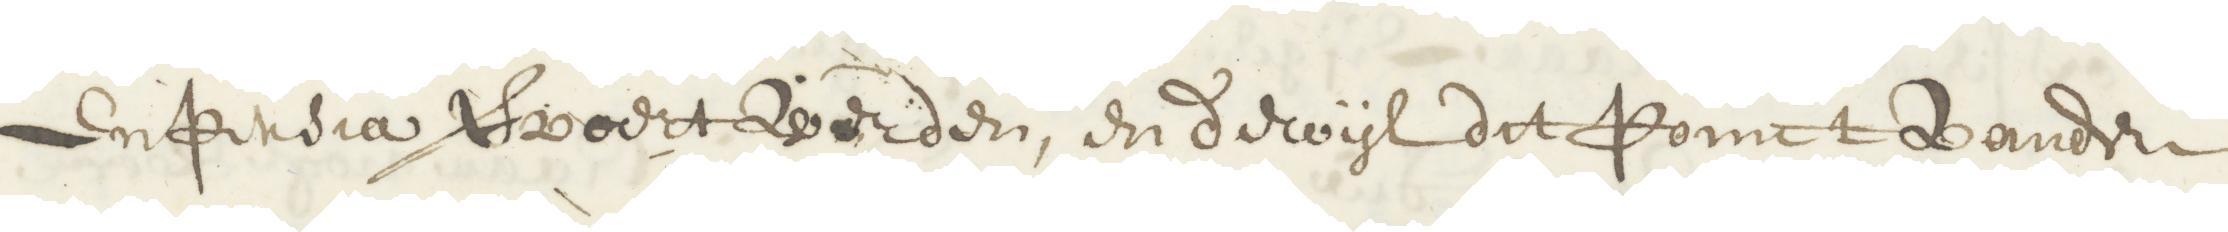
En persia vervoert werden, en dewijl dit poinct vanden
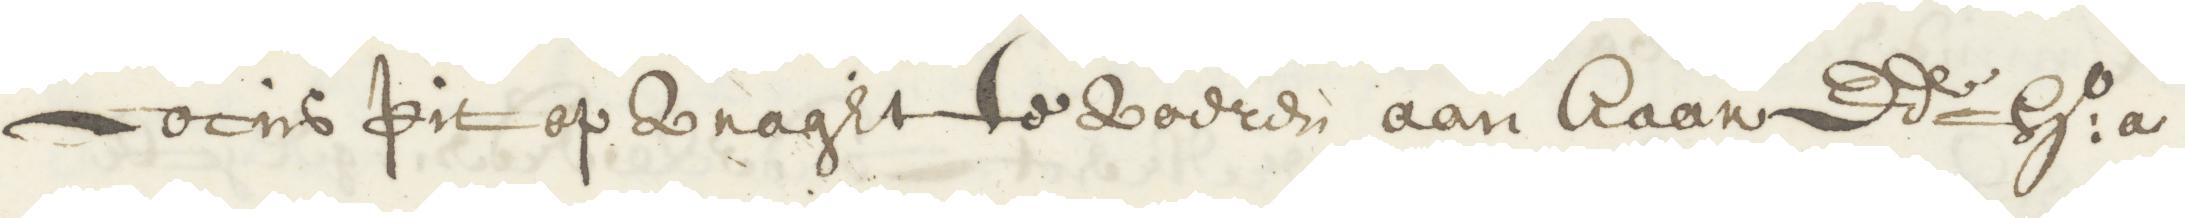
cocus pit op vraght te voeren aan haar Ed=le h:o a
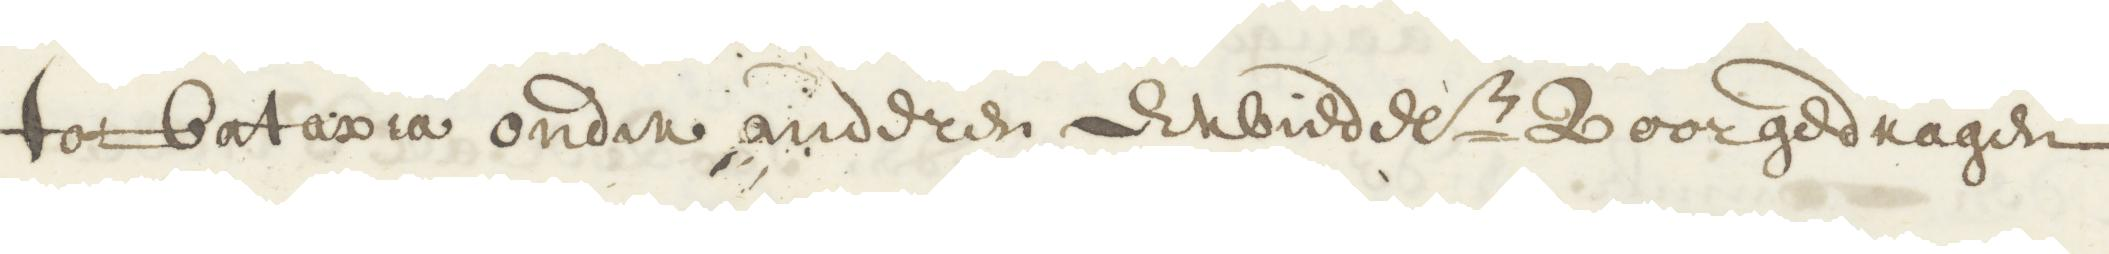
tot batavia onder anderen Eerbiedel=k voorgedragen
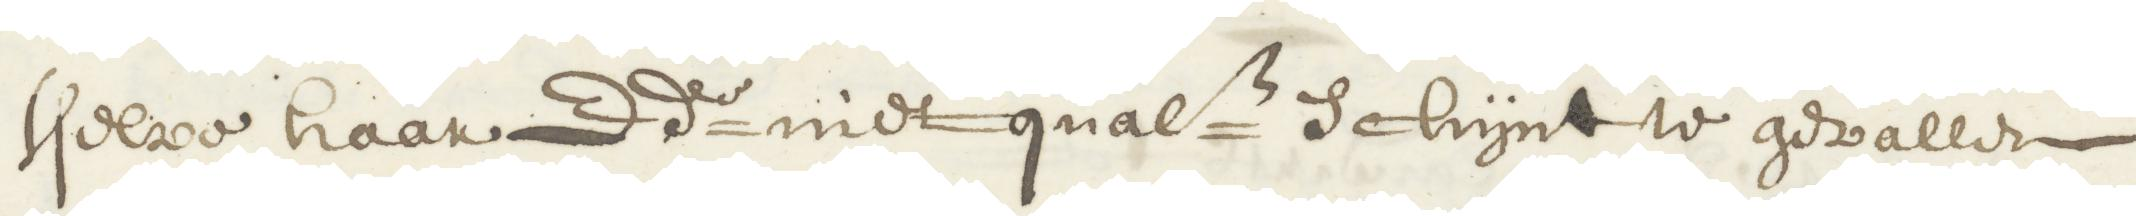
tselve haar Ed=le niet qual=k schijnt te gevallen
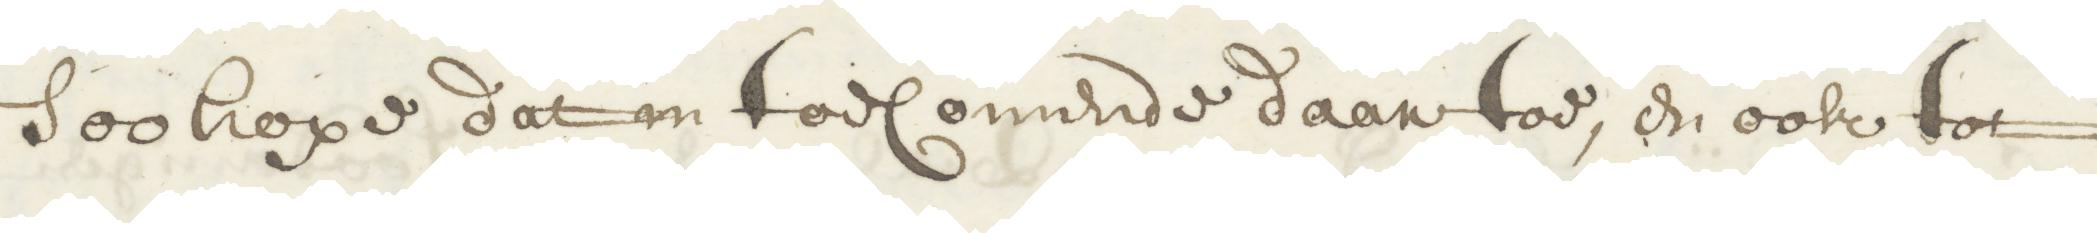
soo hope dat in toecomende daar toe, en ook tot
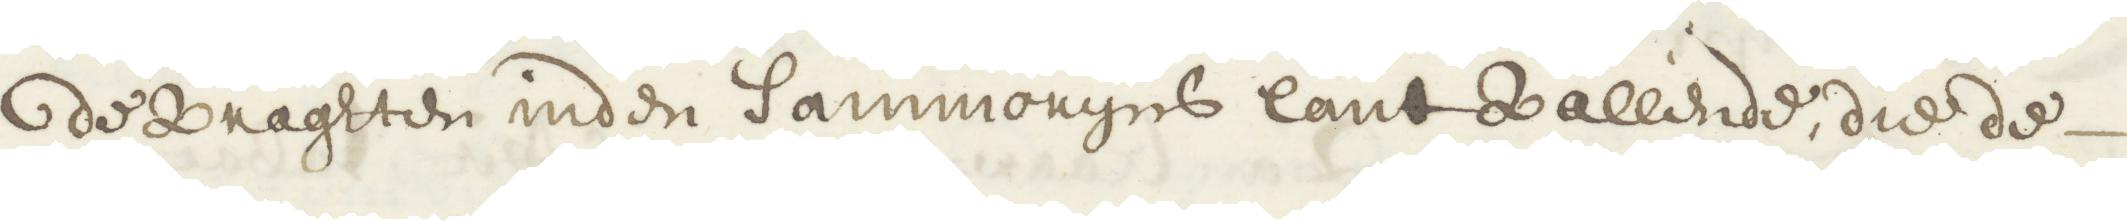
de vraghten inden sammorijns lant vallende, die de —
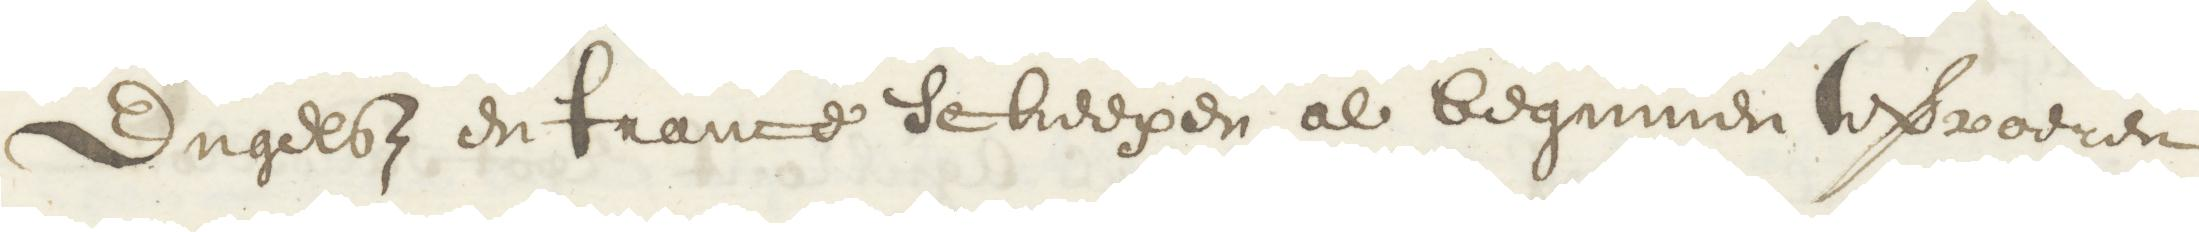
Engelsen en france scheepen al beginnen te vervoeren
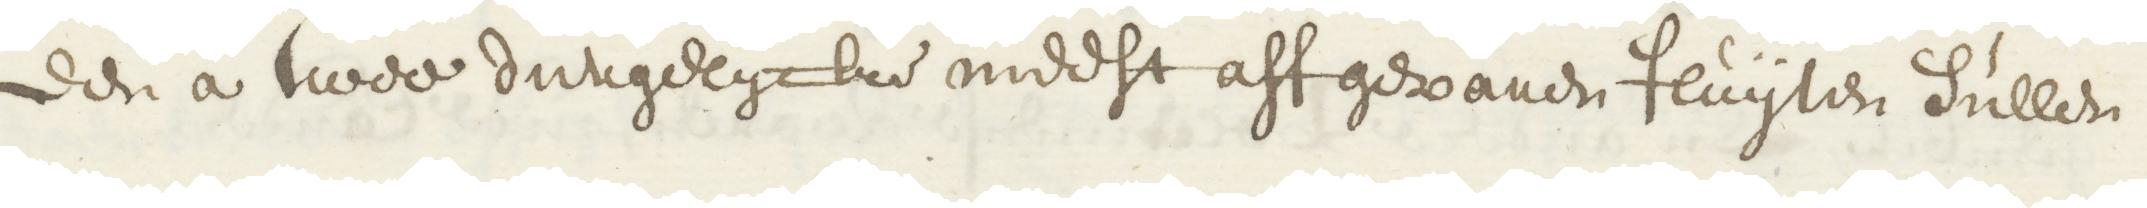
een a twee diergelijcke meest affgevaren fluijten sullen
